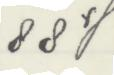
885
